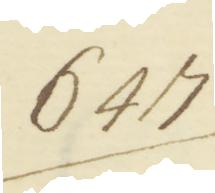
647
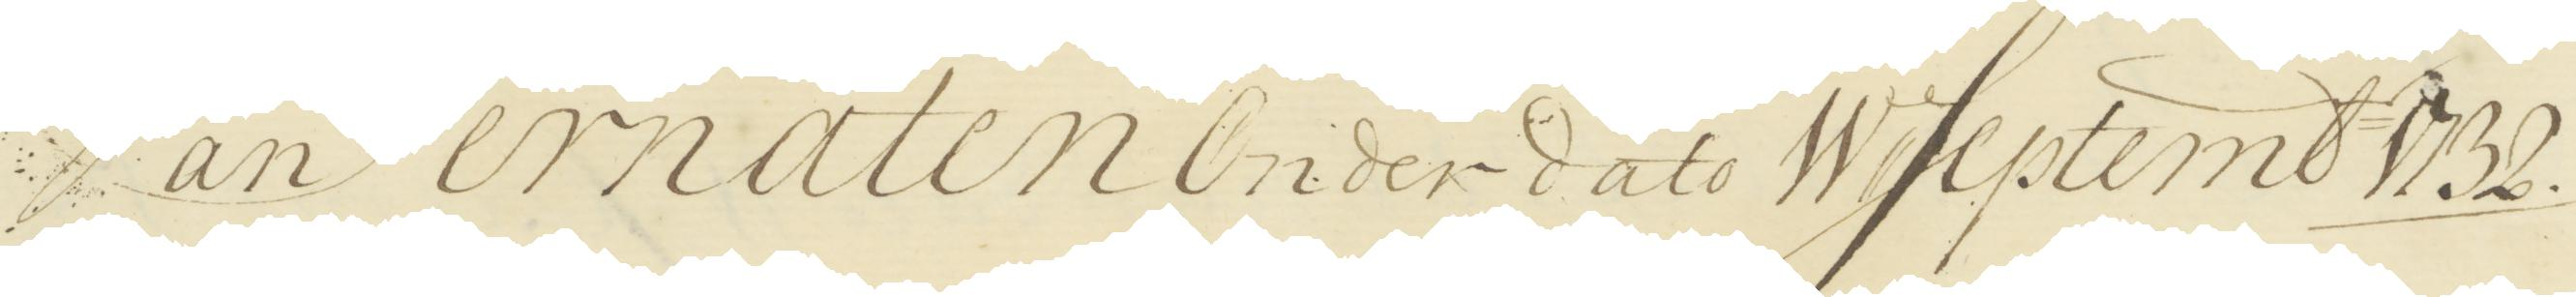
Van Ternaten Onder dato 11„e Septemb=r 1732.
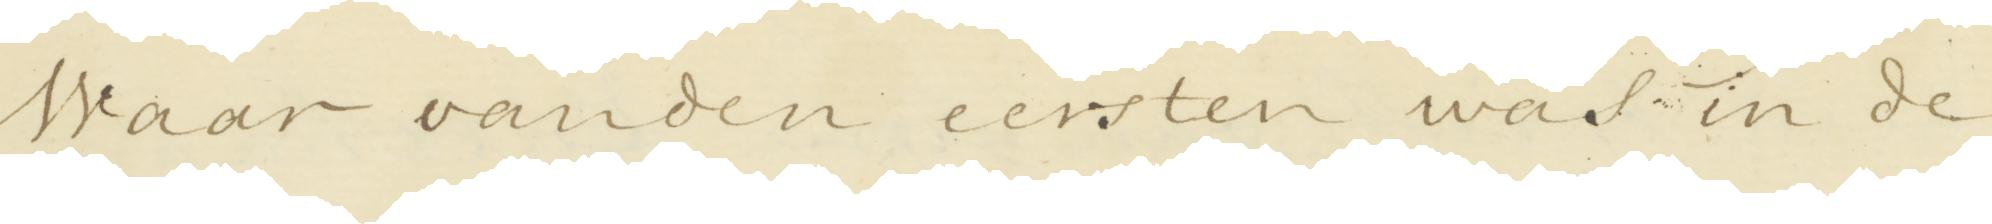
Waar van den eersten was in de
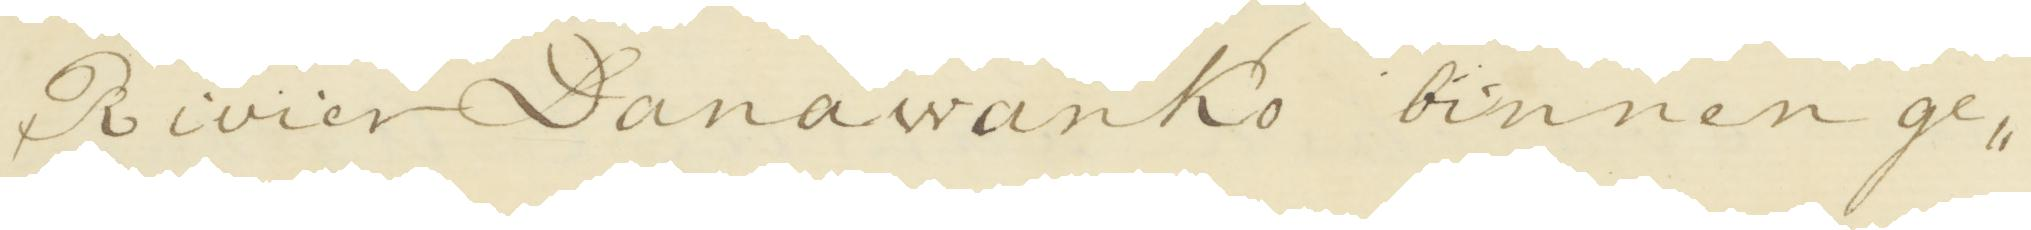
Rivier Danawanko binnen ge„
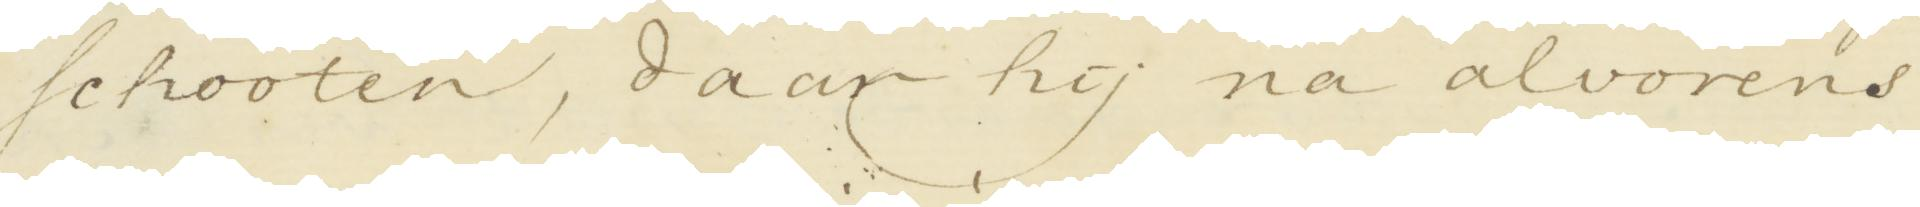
schooten, daar hij na alvorens
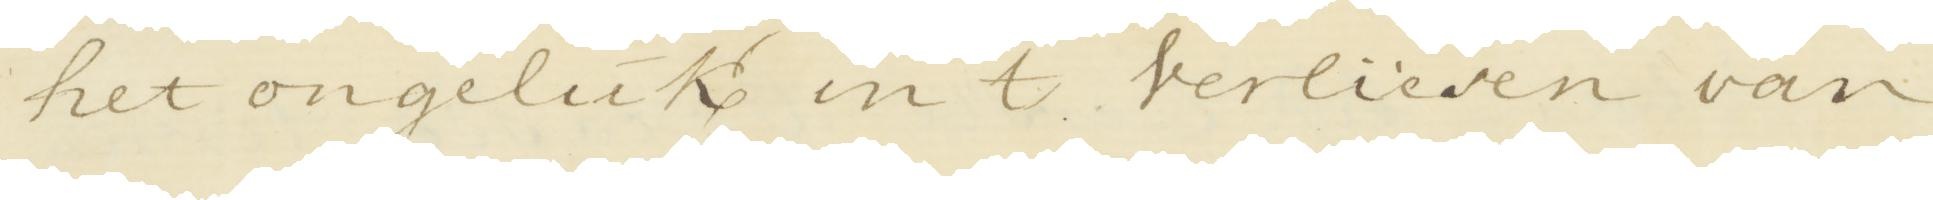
het ongeluk in ’t verliesen van
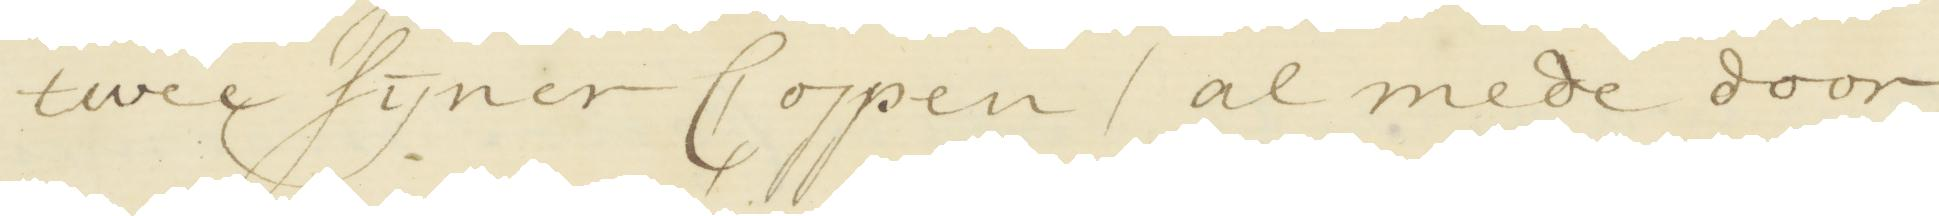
twee sijner Coppen (al mede door
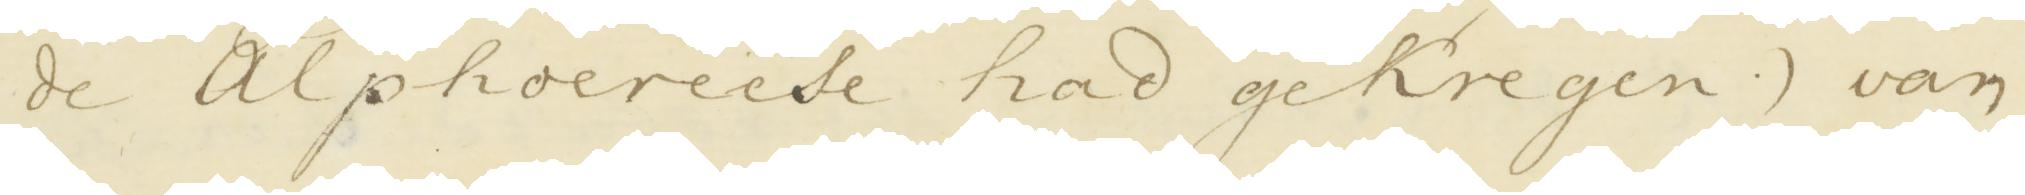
de Alphoereese had gekregen .) van
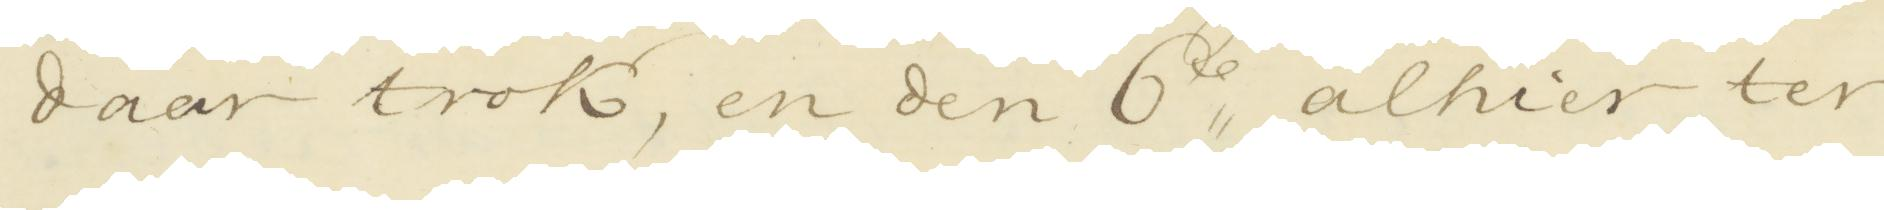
daar trok, en den 6„e alhier ter
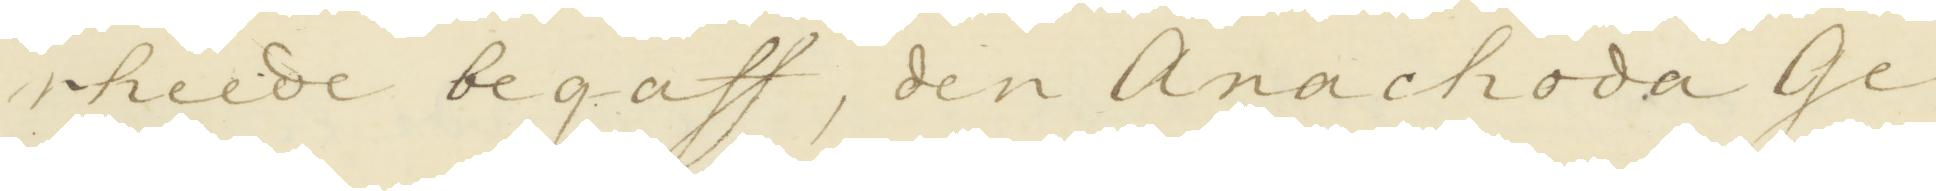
rheede begaff, den Anachoda Ge
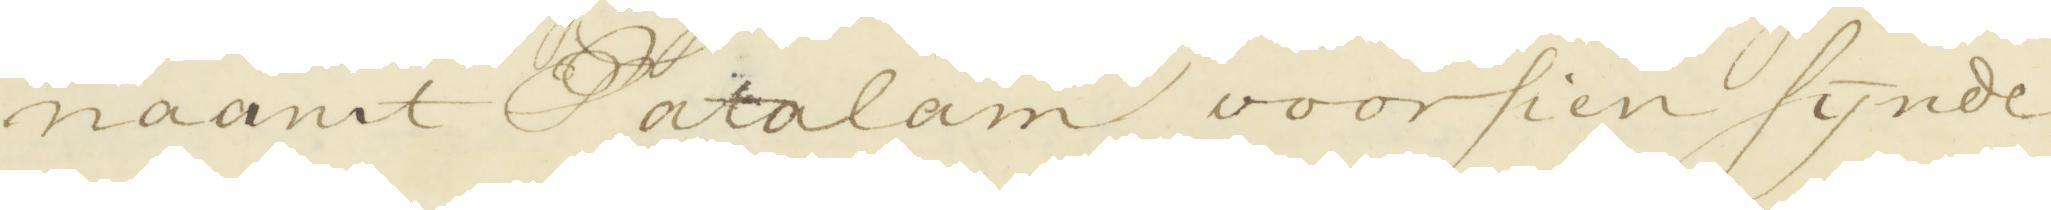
naamt Patalam voorsien sijnde
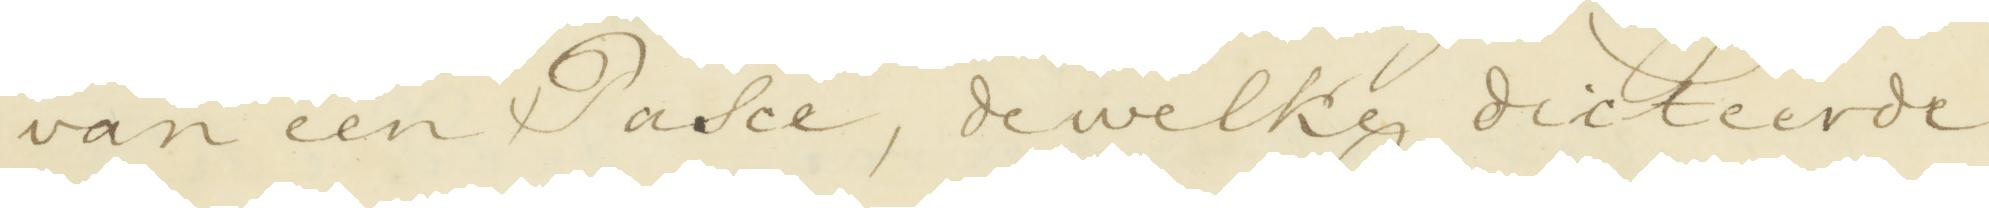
van een Pasce, dewelke dicteerde
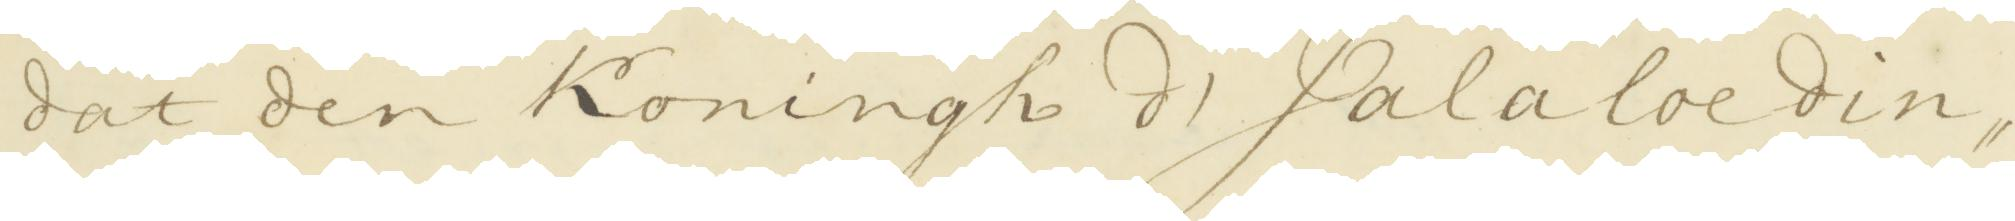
dat den koningh d' Palaloedin„
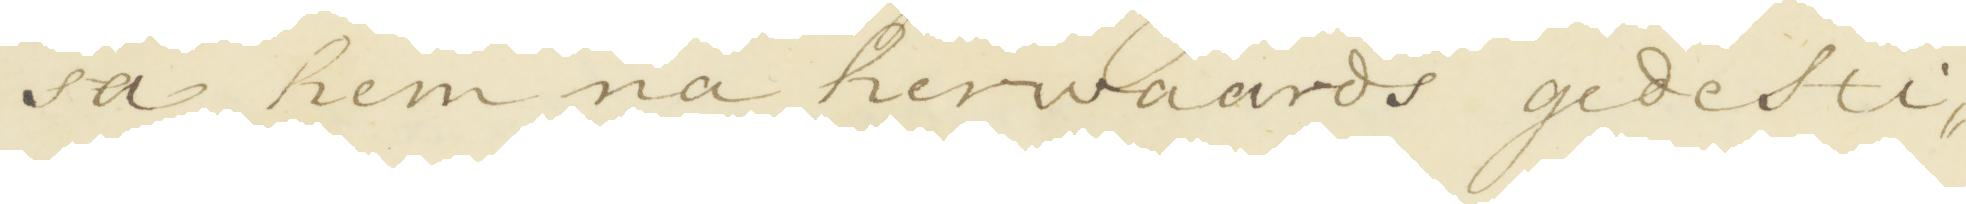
sa hem na herwaards gedesti„
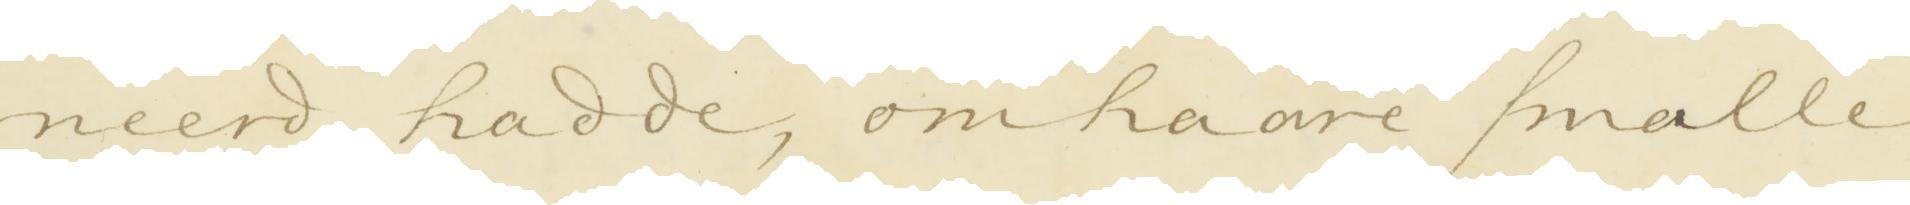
neerd hadde, om haare smalle
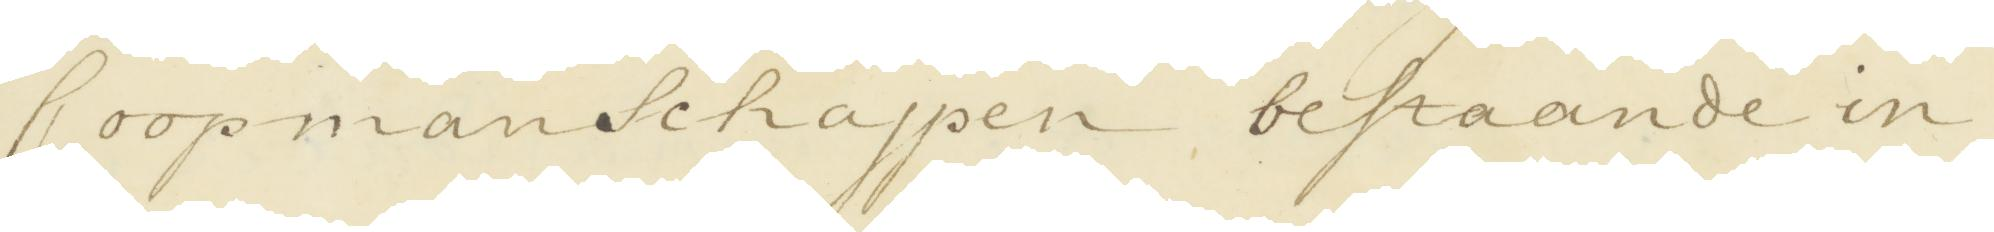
Coopmanschappen bestaande in
